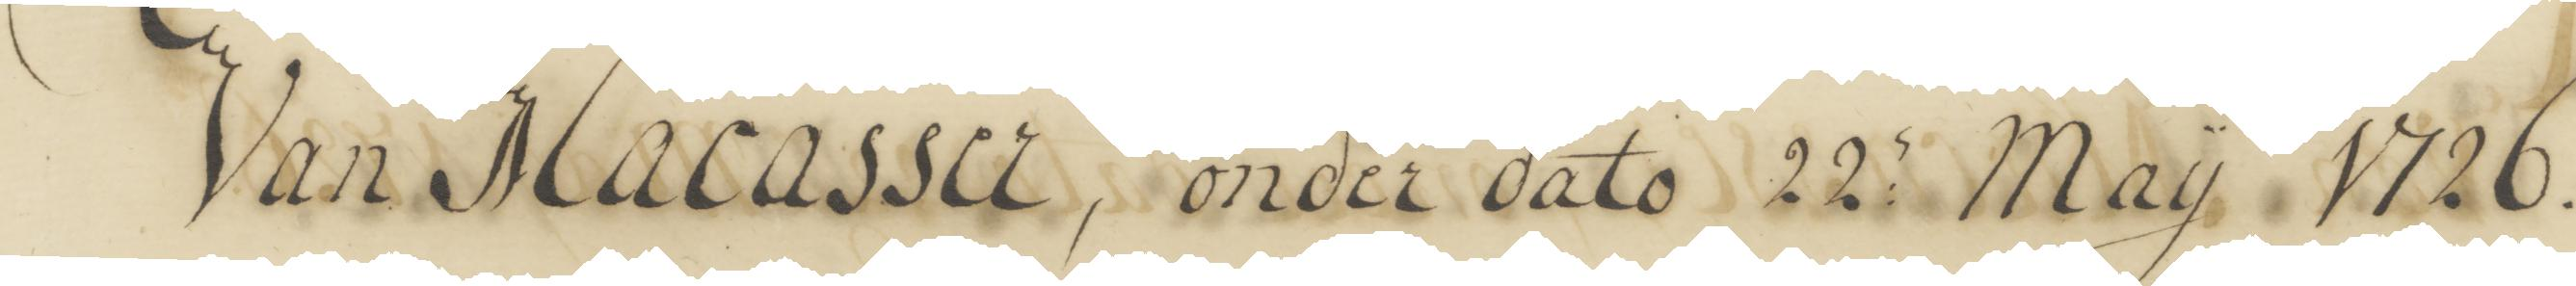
Van Macasser, onder dato 22:' Maij 1726.
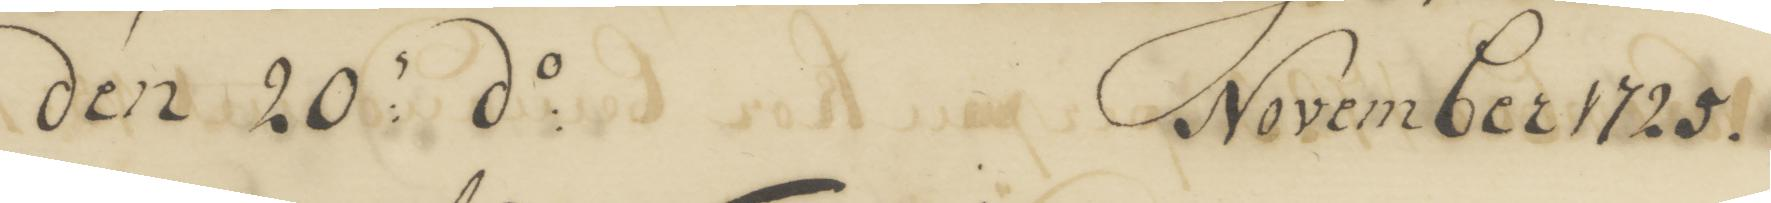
den 20:' d:o November 1725.
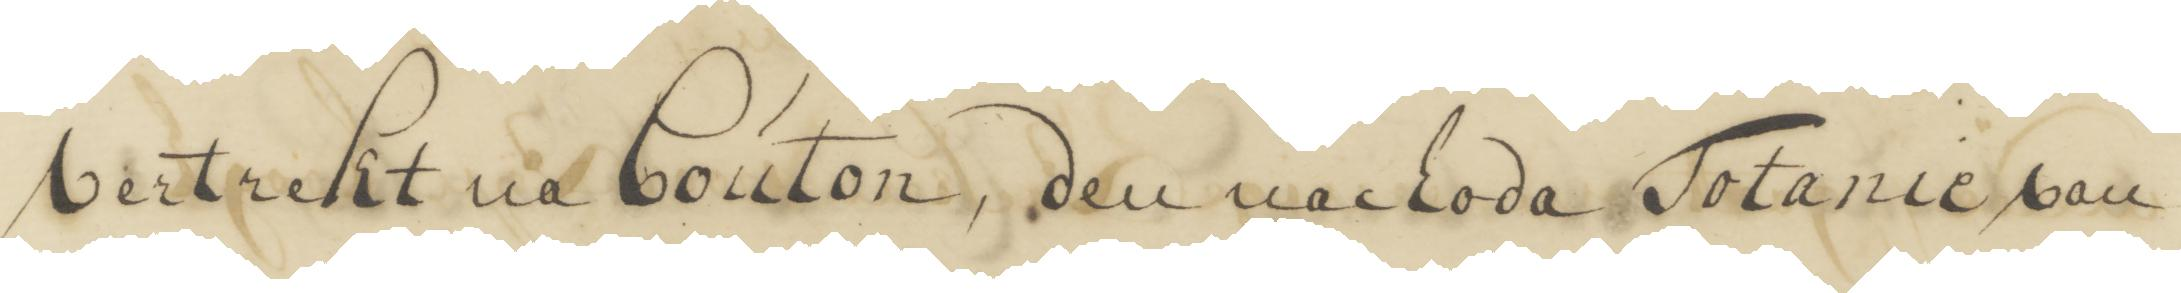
vertrekt na bouton, den nachoda Totanie van
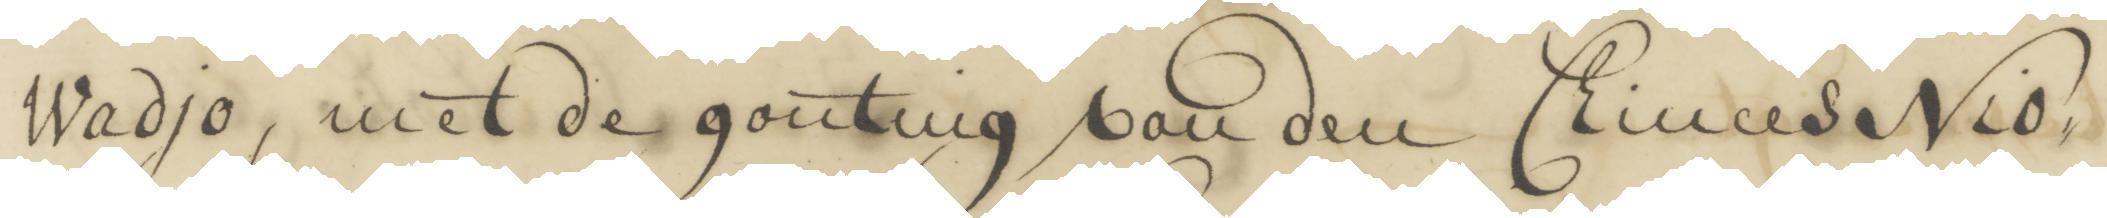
Wadjo, met de gonting van den Chinees Nio„
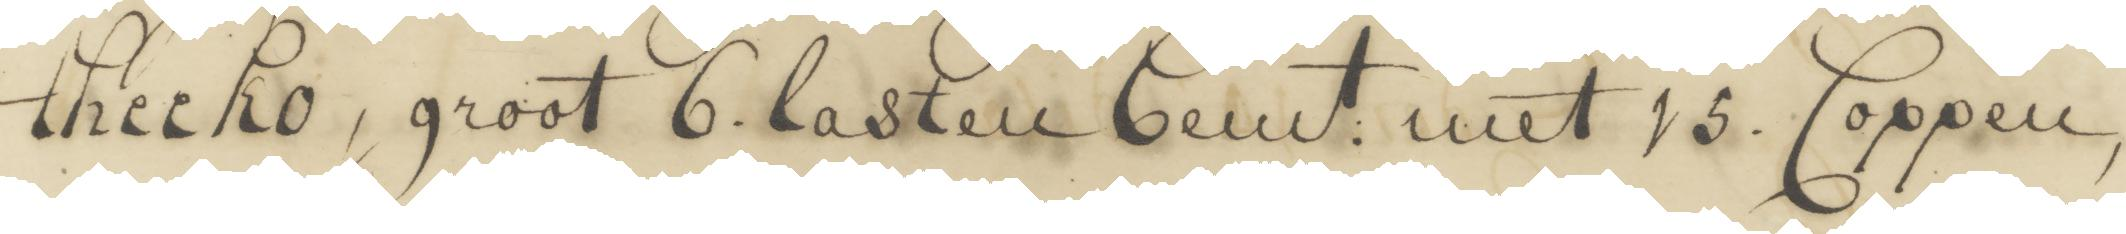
theeko, groot 6. lasten bem:t met 15. Coppen,
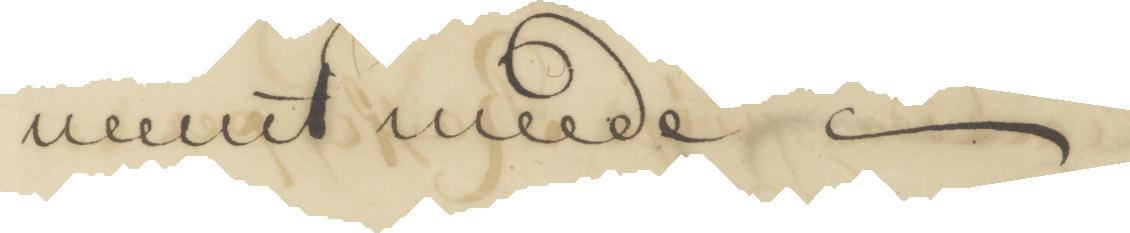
neemt meede —
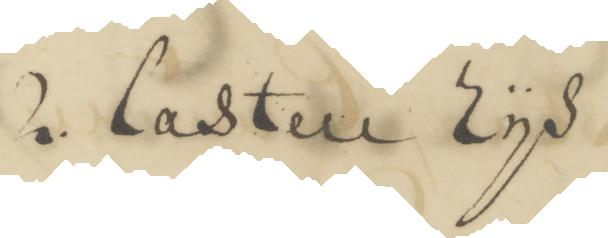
2. lasten rijs
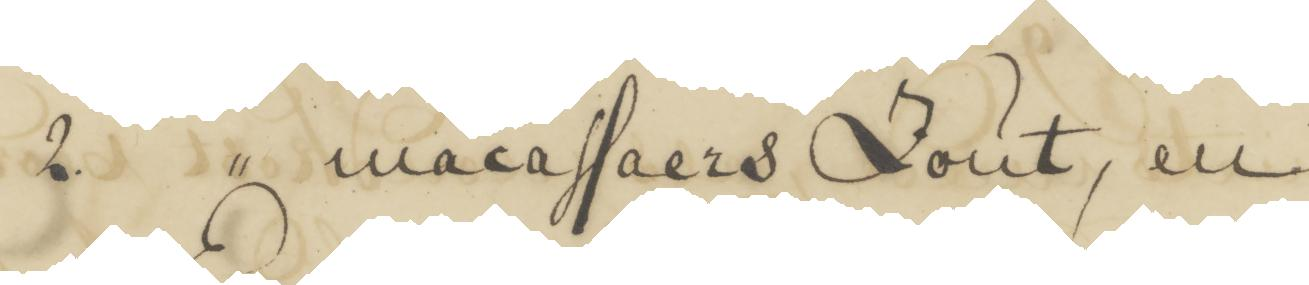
2. „ macassaers zout, en
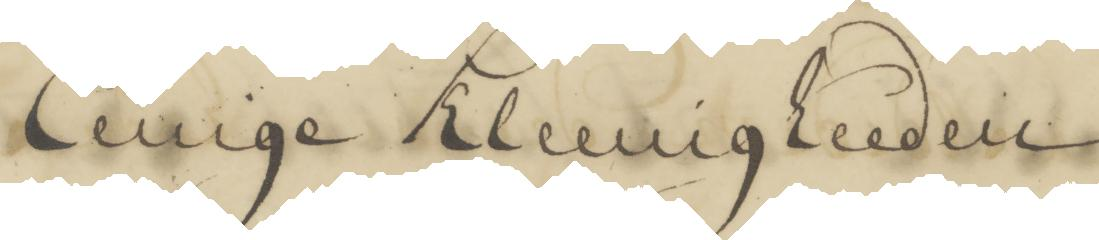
Eenige kleenigheeden
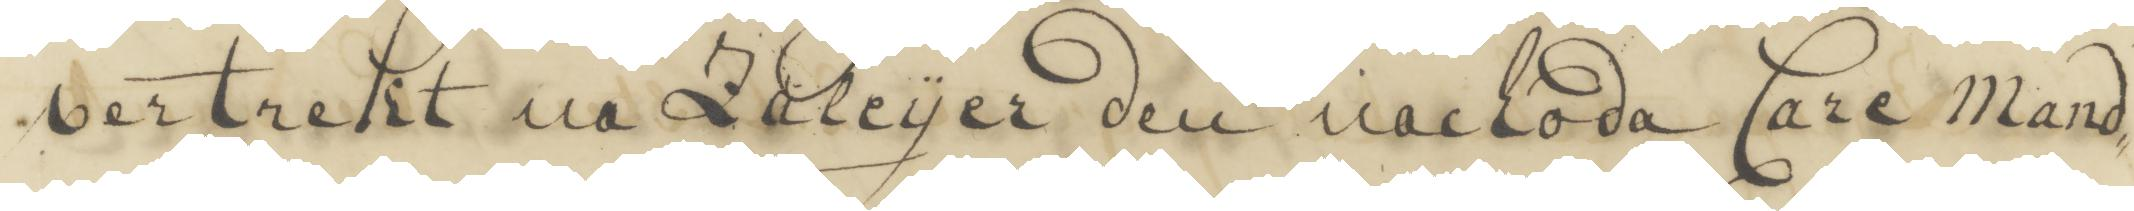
vertrekt na Zaleijer den nochoda Care mand„
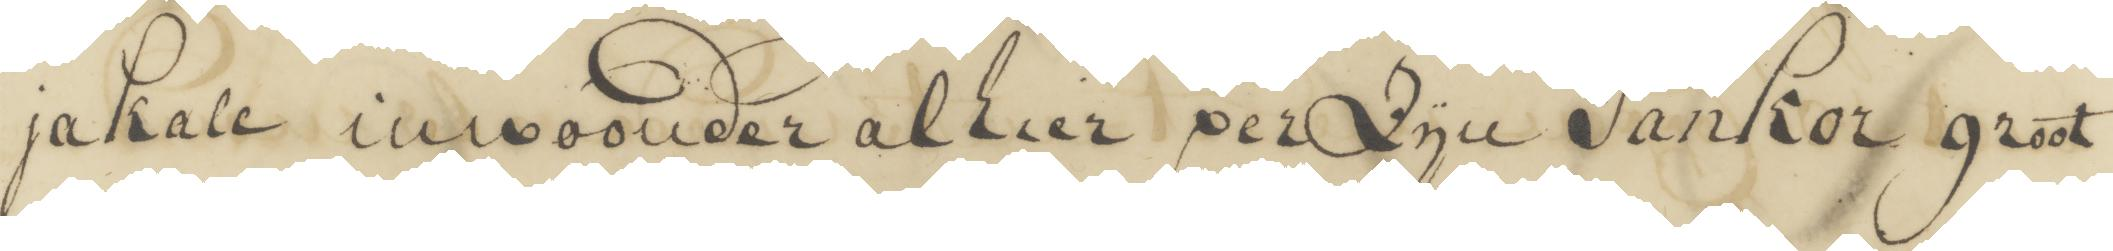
jakale inwoonder alhier per zijn Pankor groot
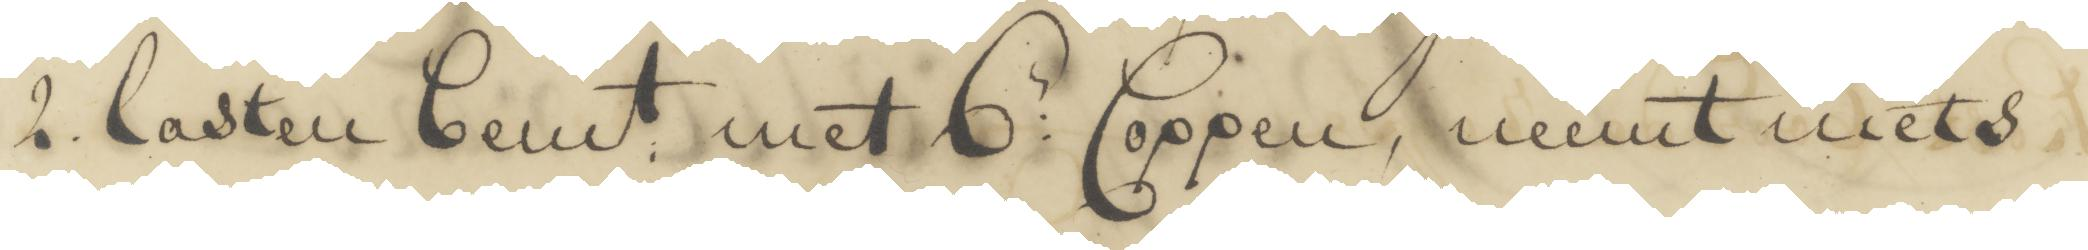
2. lasten bem:t met 6:' Coppen, neemt niets
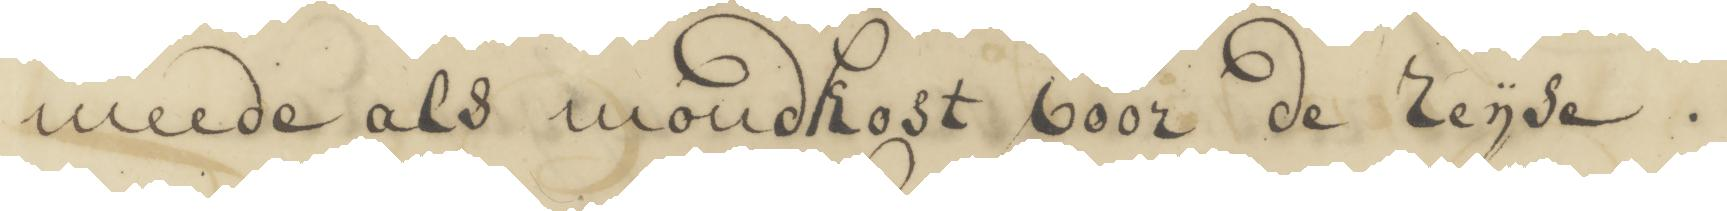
meede als mondkost voor de reijse.
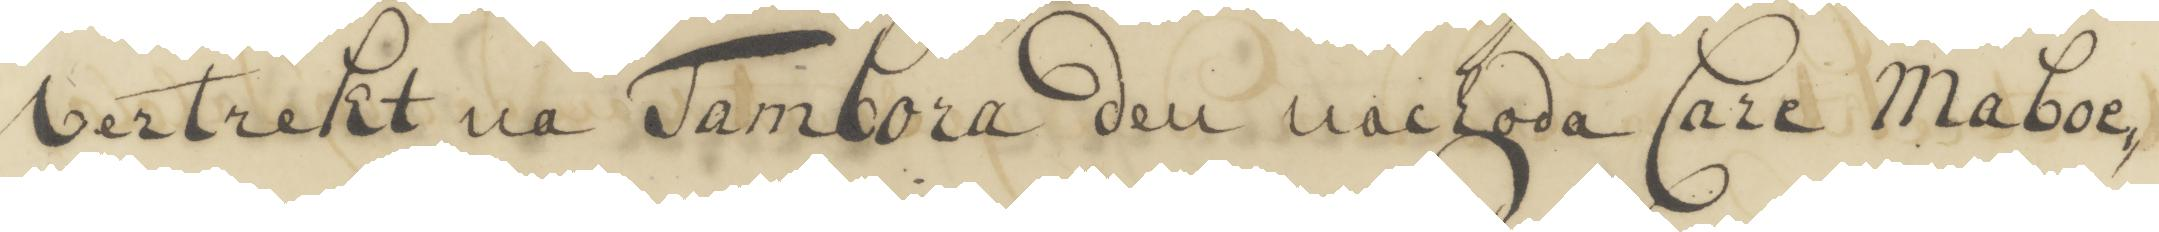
vertrekt na Tambora den nachoda Care Maboe„
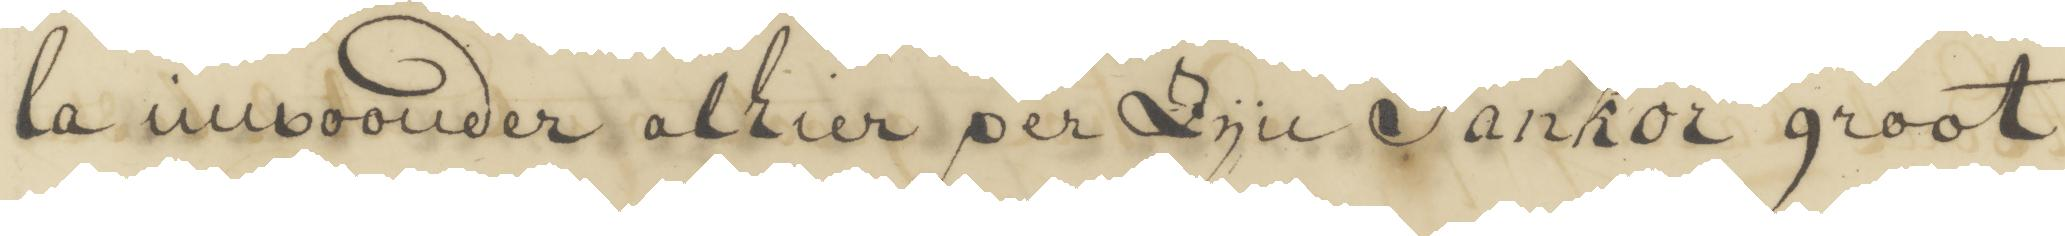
la inwoonder alhier per zijn Pankor groot
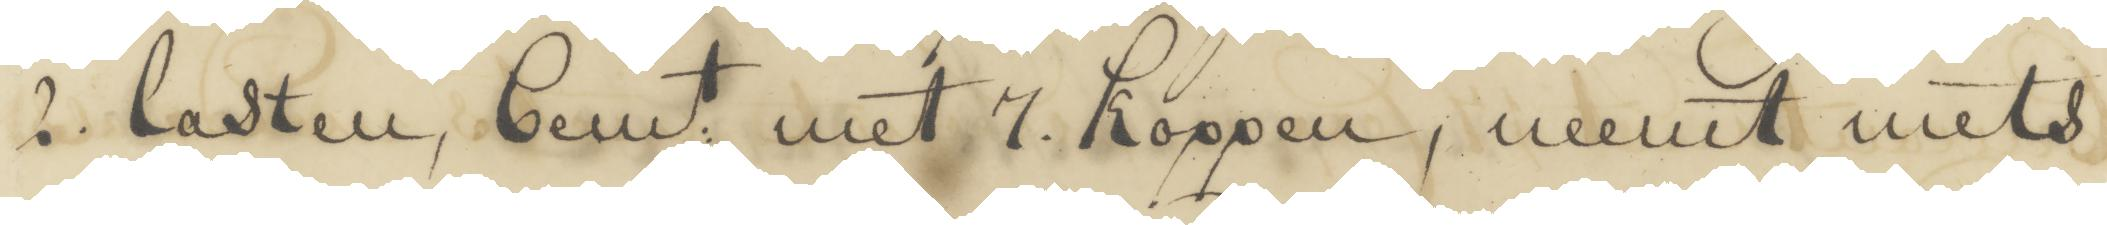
2. lasten, bem:t met 7. koppen, neemt niets
